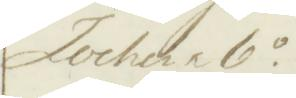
Zocher & C.o
